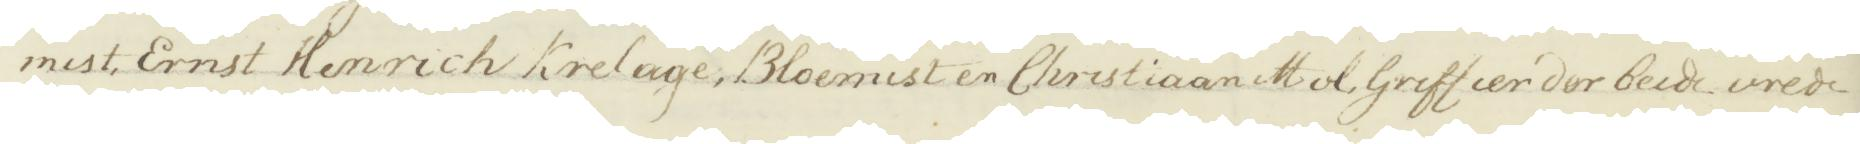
mist Ernst Henrich Krelage, Bloemist en Christiaan Mol Griffier der beide vrede
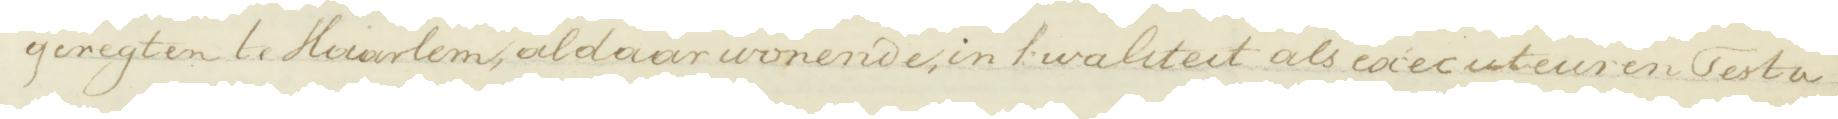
geregten te Haarlem, aldaar wonende, in kwaliteit als executeuren Testa
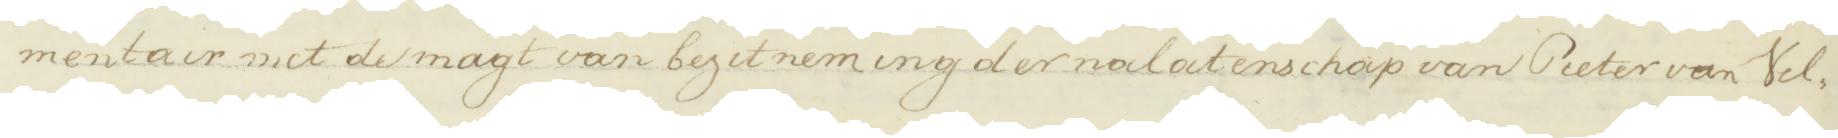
mentair met de magt van bezitneming der nalatenschap van Pieter van Vel„
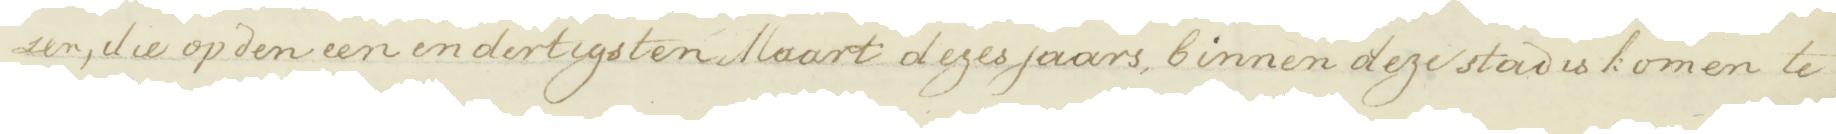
sen, die op den een en dertigsten Maart dezes jaars, binnen deze stad is komen te
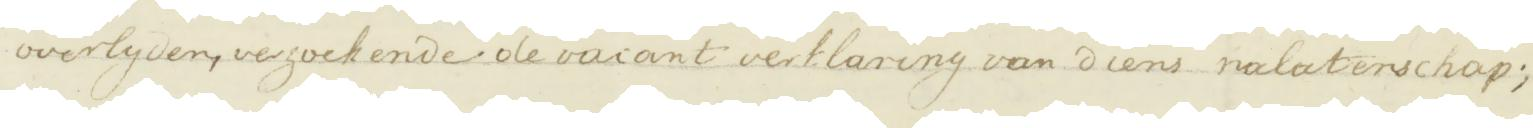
overlyden verzoekende de vacant verklaring van diens nalatenschap;
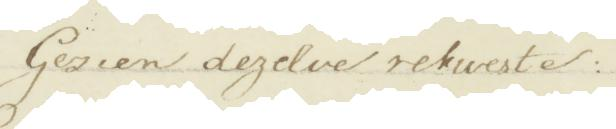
Gezien dezelve rekweste:
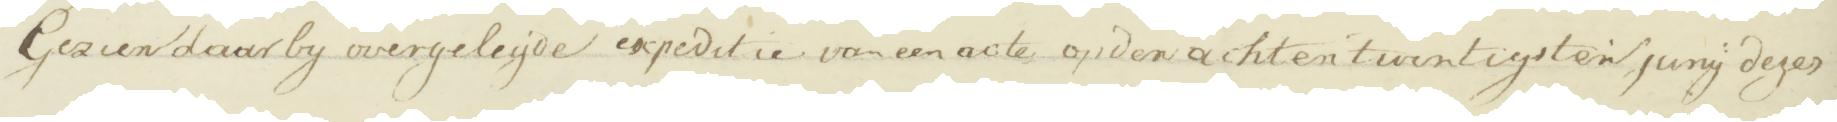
Gezien daar by overgelegde expeditie van een acte op den achten twintigsten Junij dezes
